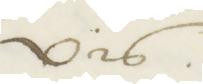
vis.
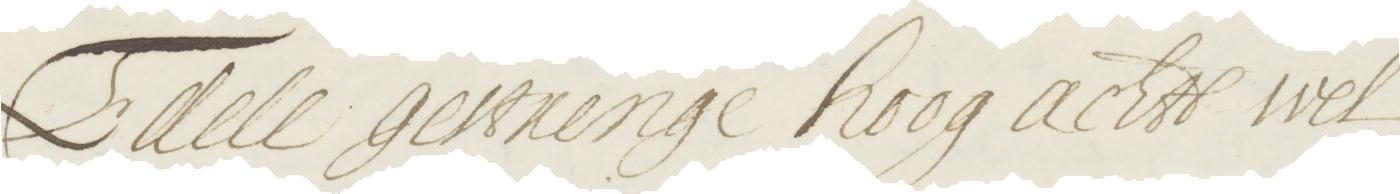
Edele gestrenge hoog achtb wel
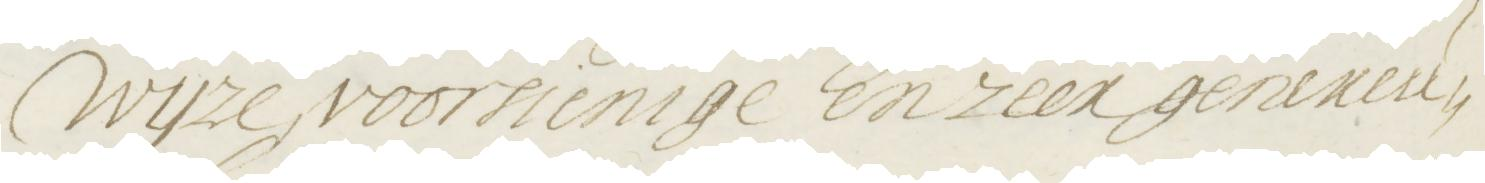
wyze, voorsienige en zeer genereu„
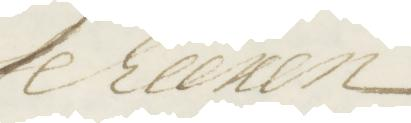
se heeren
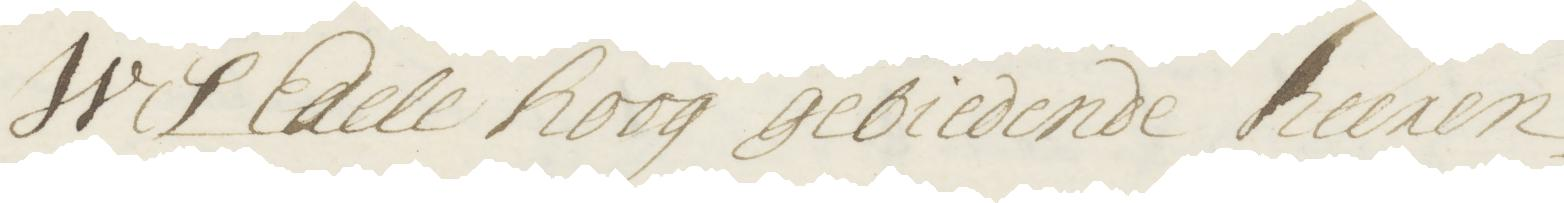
Wel Edele hoog gebiedende heeren
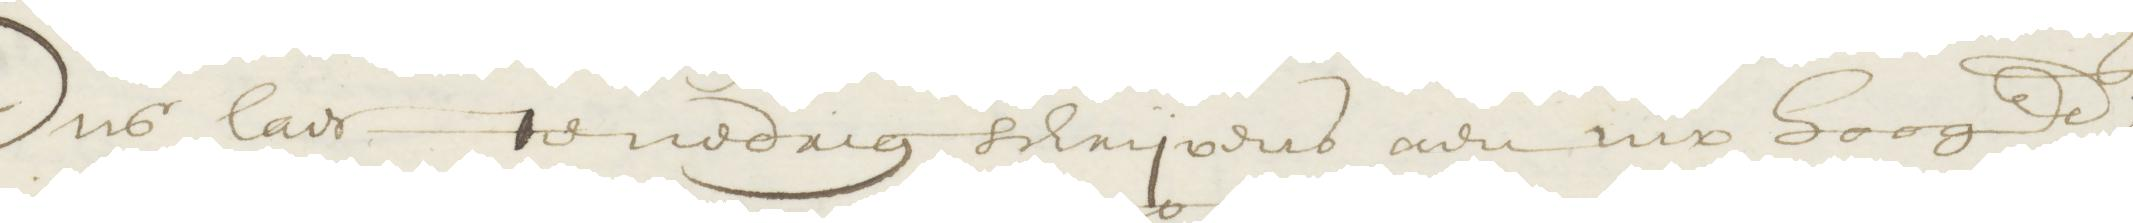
Ons laes te nedrig schrijvens aen uw hoog Eds
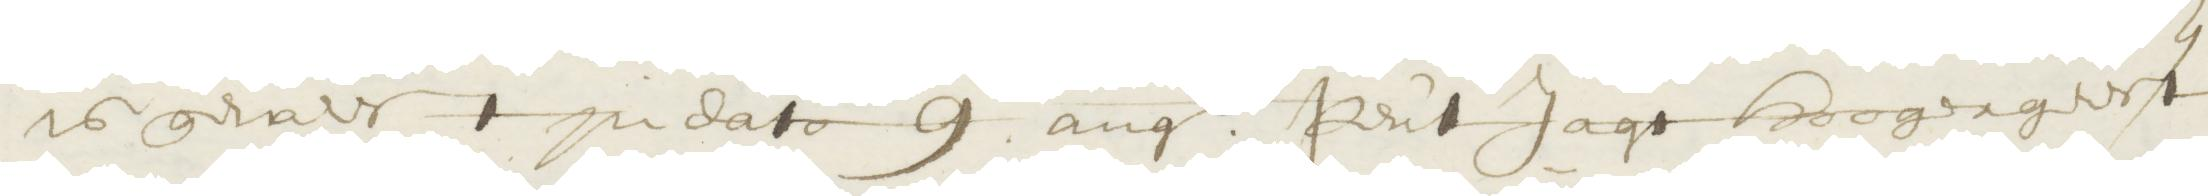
is geweest jn dato 9. aug.o per't Jagt hoogergeest
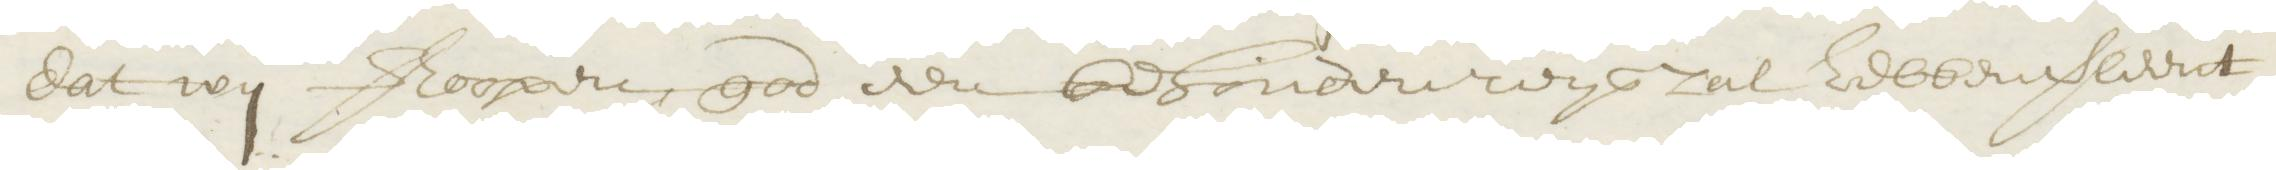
dat wij verhoopen, god een behouden reijs zal hebben verleent
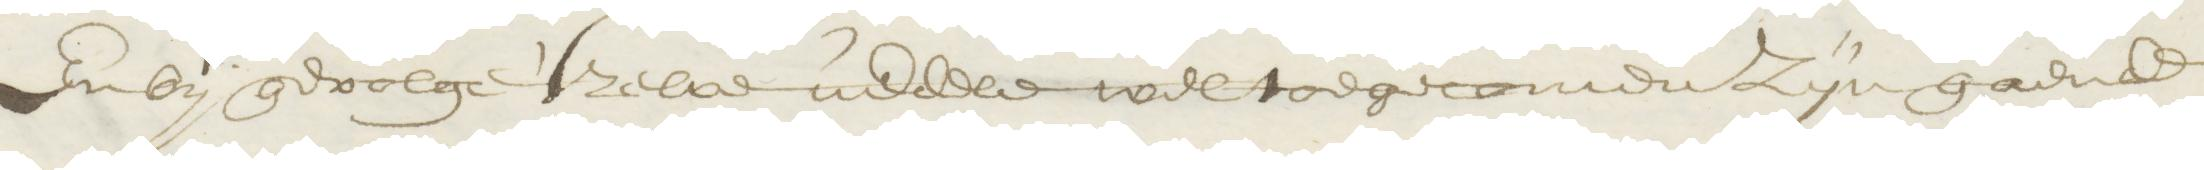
En bij gevolge ’t zelve u Edele wel toegecomen zijn gaende
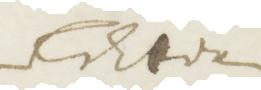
Echter
